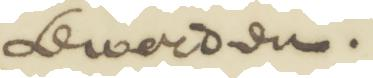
tewerden.
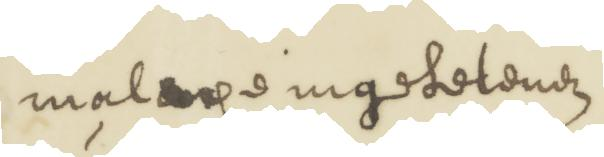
malaxe ingesetenen
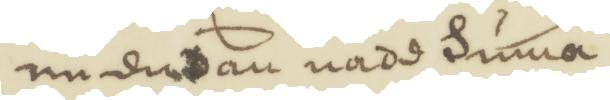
nu en dan nade Suma
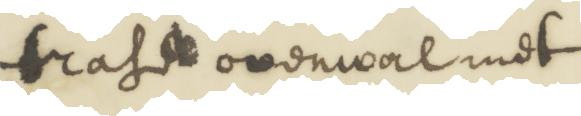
trase overwal met
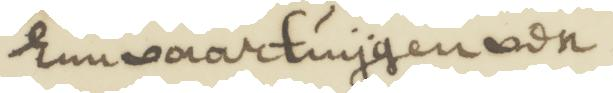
hun vaartuijgen ver
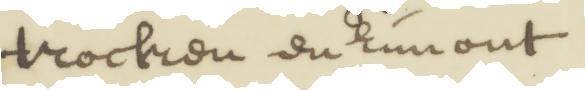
trocken en hun ont
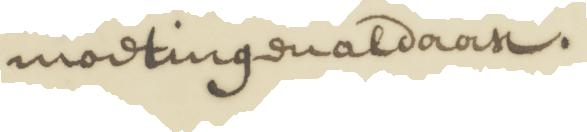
moetingen aldaar.
